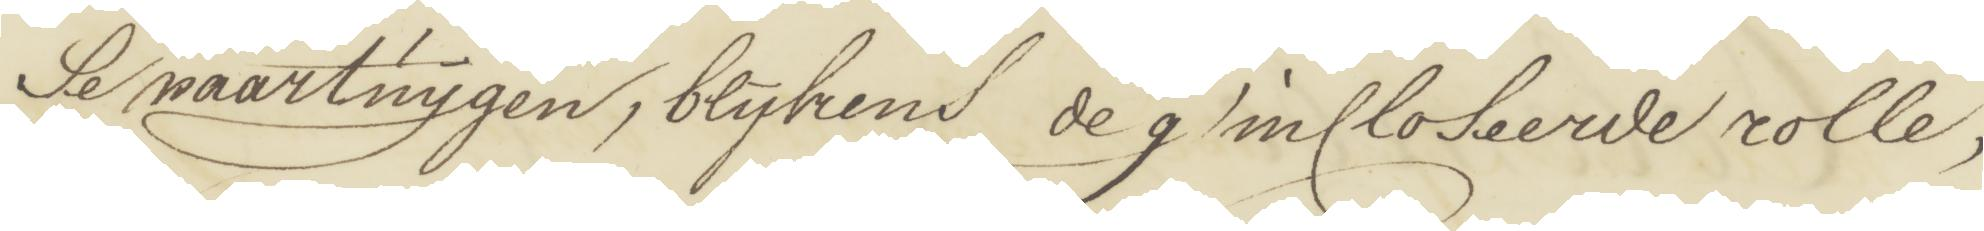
se vaartuijgen, blijkens de g’incloseerde rolle,
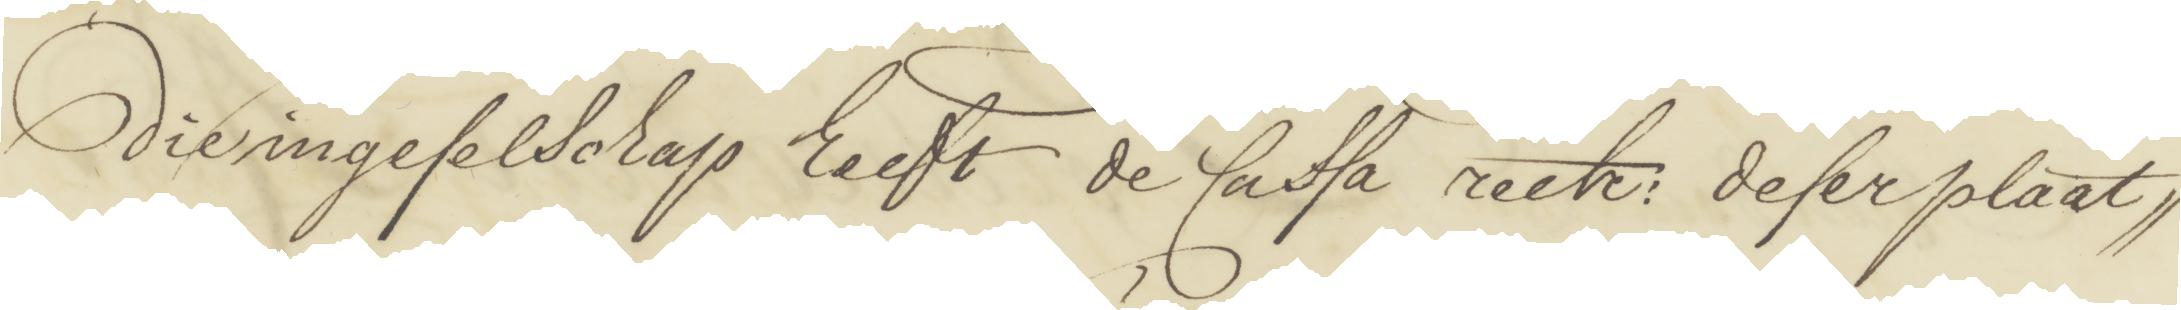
die in geselschap heeft de Cassa reek: deser plaat„
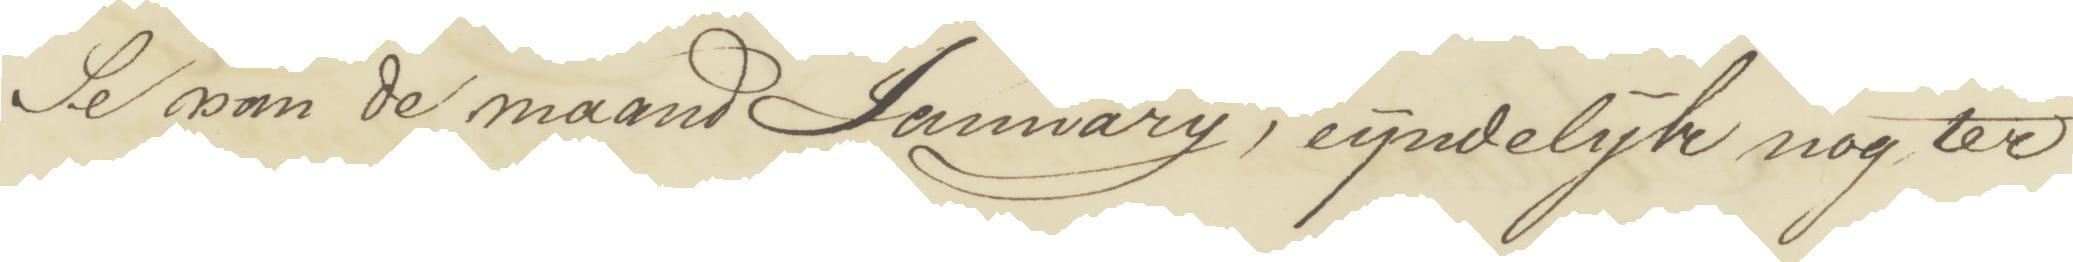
se van de maand Januarij, eijndelijk nog ter
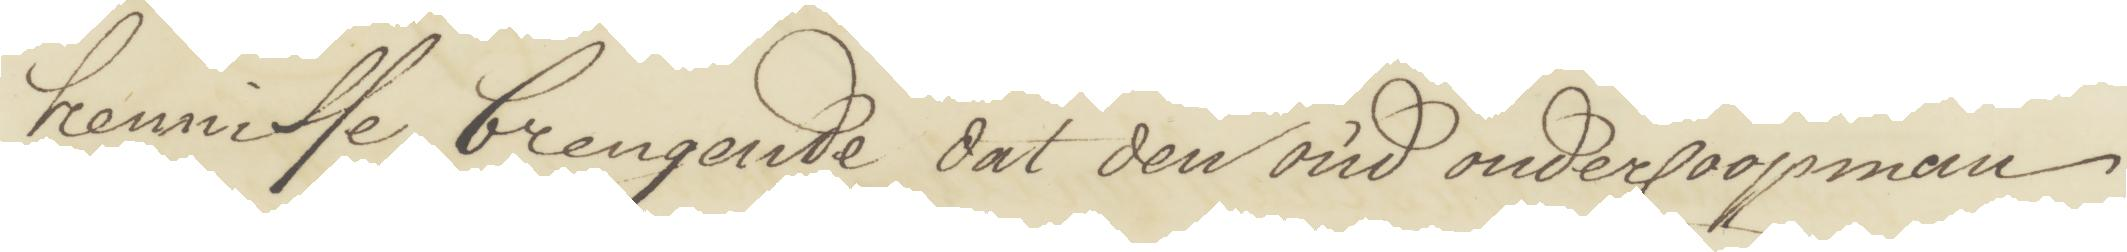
kennisse brengende dat den oud ondercoopman
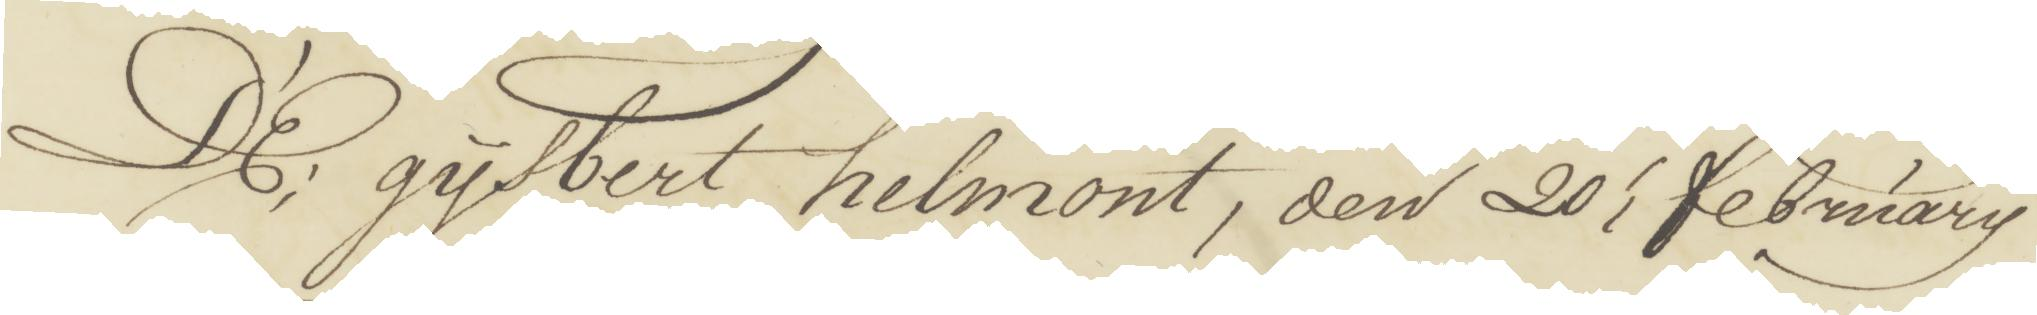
D'E: gijsbert helmont, den 20:' februarij
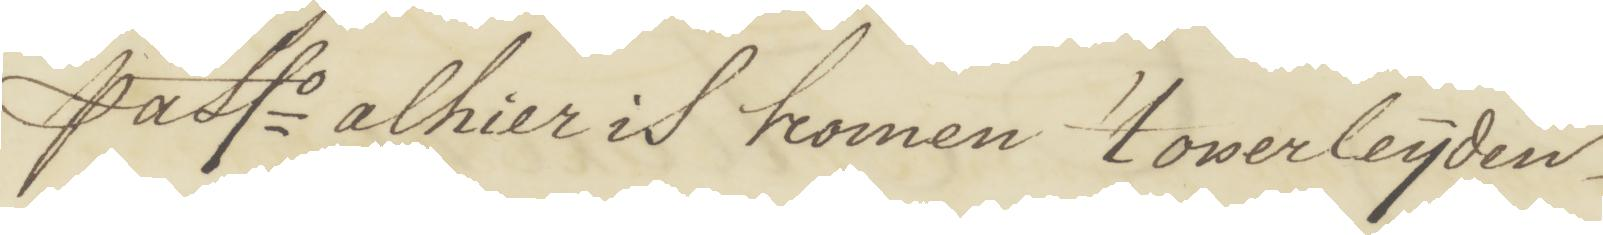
pass=o alhier is komen ’t overleijden
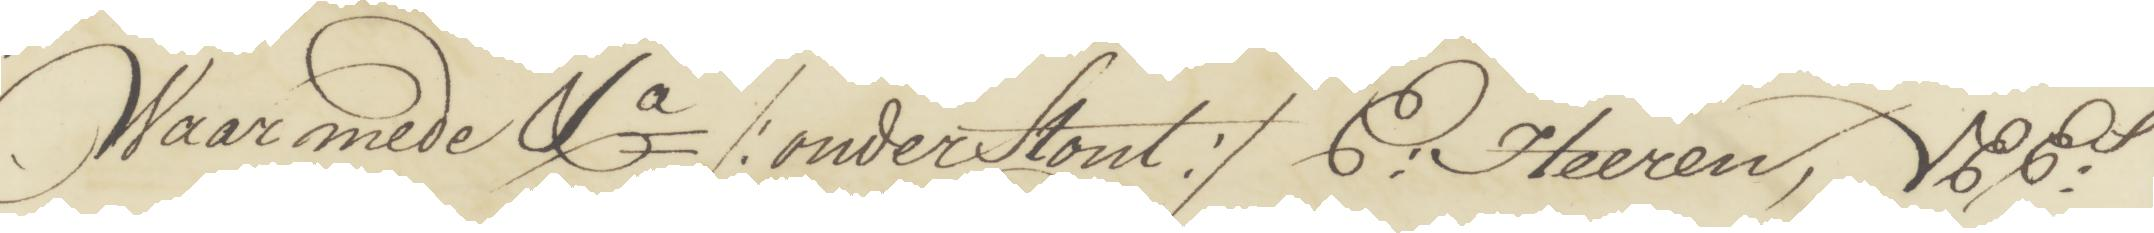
Waar mede &=A /: onderstont :/ E: Heeren, VEE:s
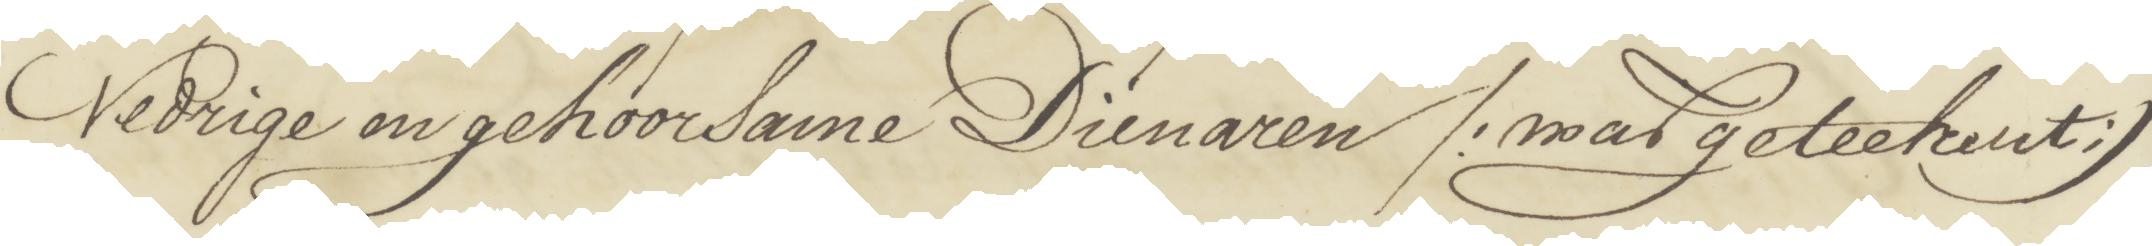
Nedrige on gehoorsame Dienaren /:was geteekent:)
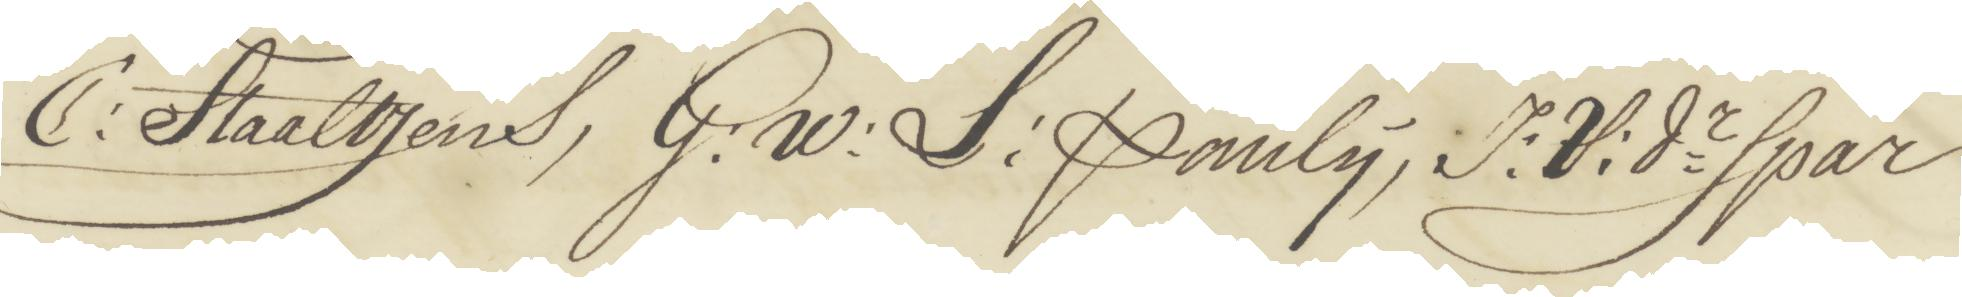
C: Staaltjens, G: w: L: Paulij, J: V: d=r spar
